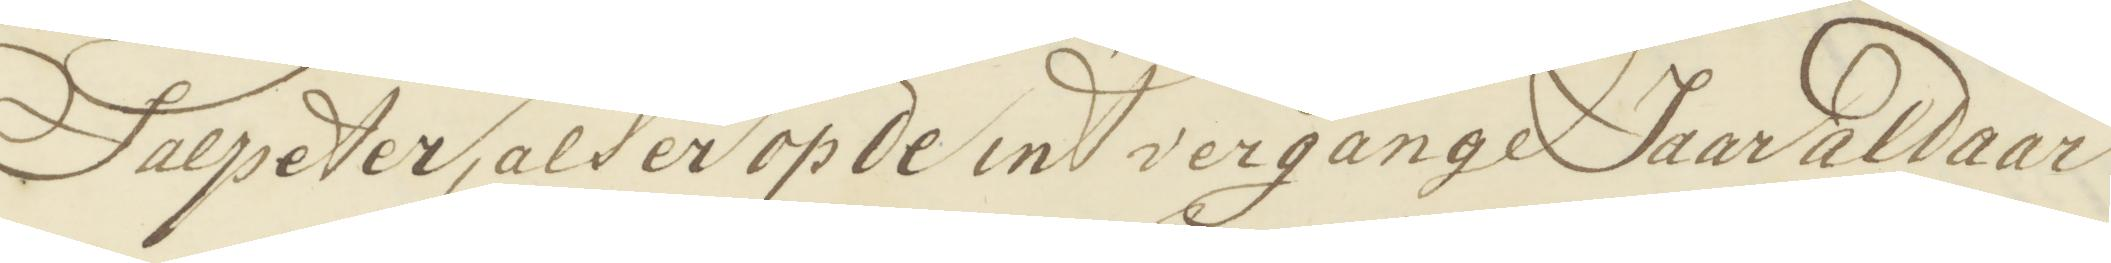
Salpeter, als er op de in't vergange Iaar aldaar
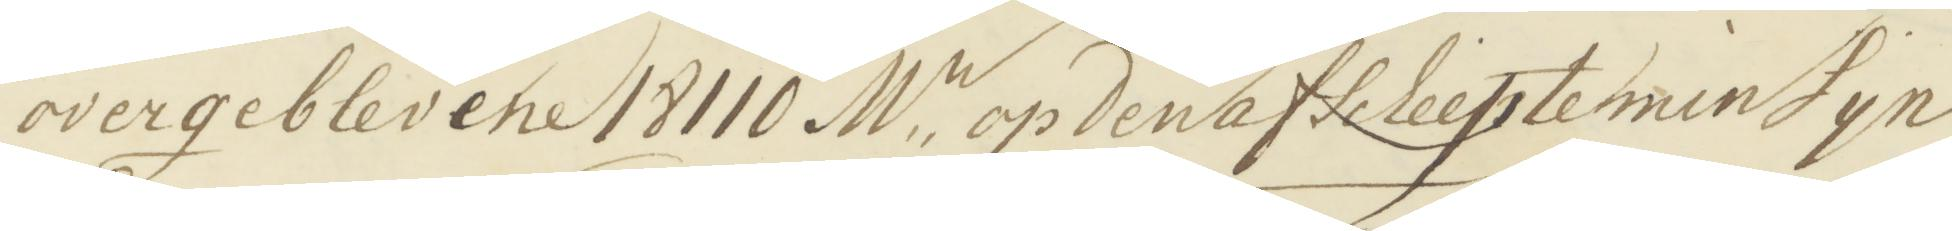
overgeblevene 18110 M„n op den afscheepte min Syn
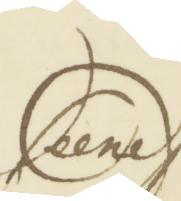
eene
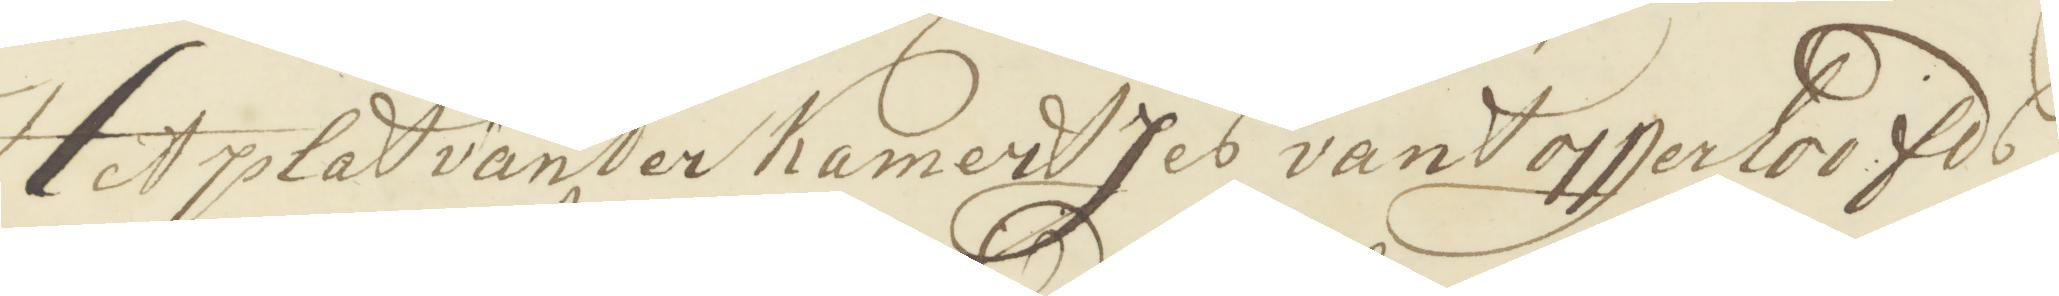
Het plat van ^ der Kamertjes van 't opperhoofds
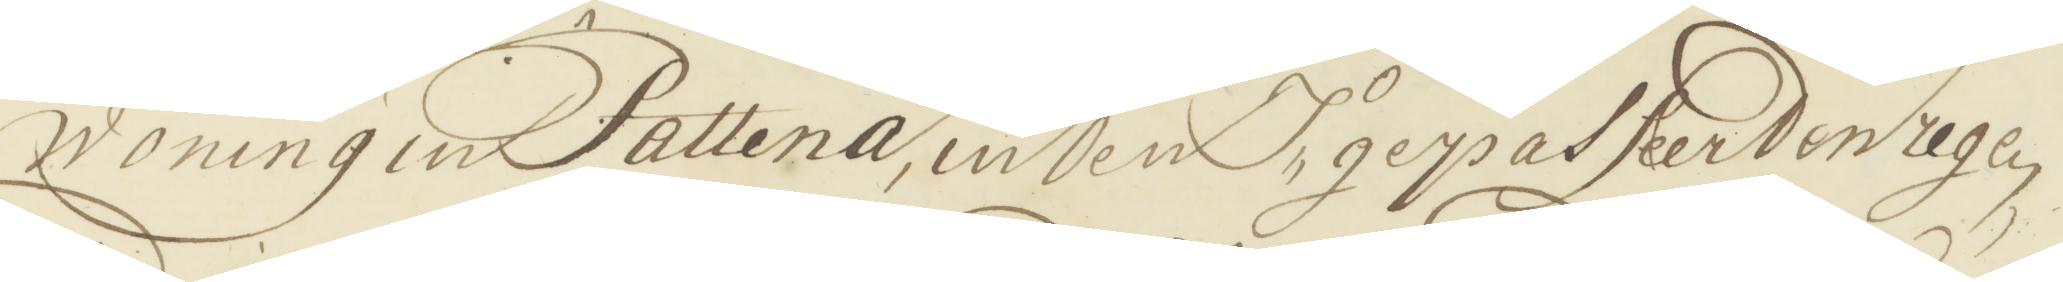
woning in Pattena, in den I„o gepasseerden regen
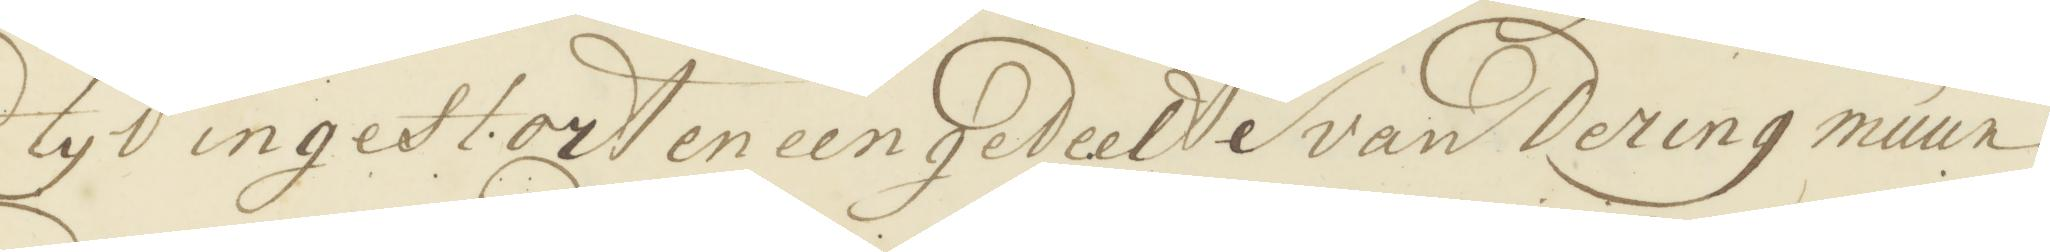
tyd ingestort en een gedeelte van de ring muur
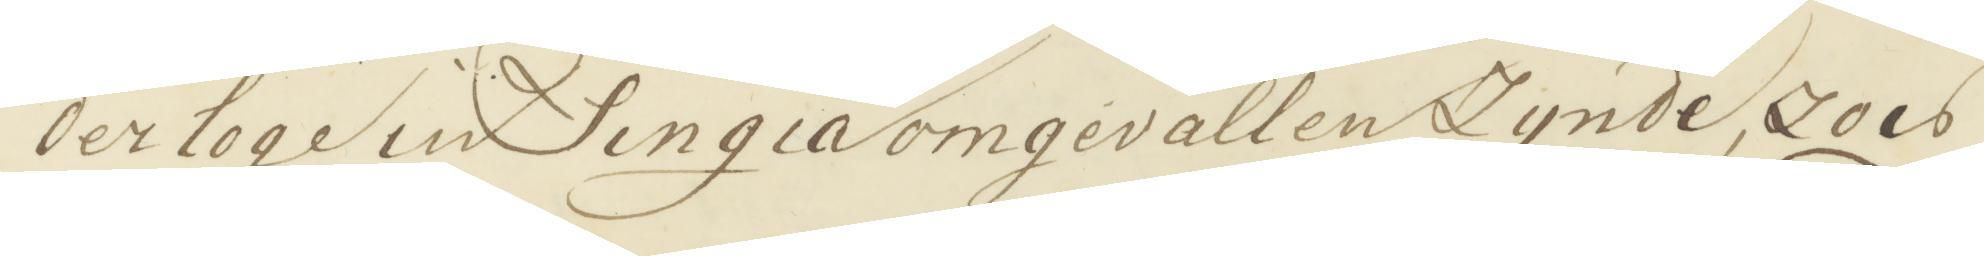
der loge in Singia omgevallen Zynde, zo is
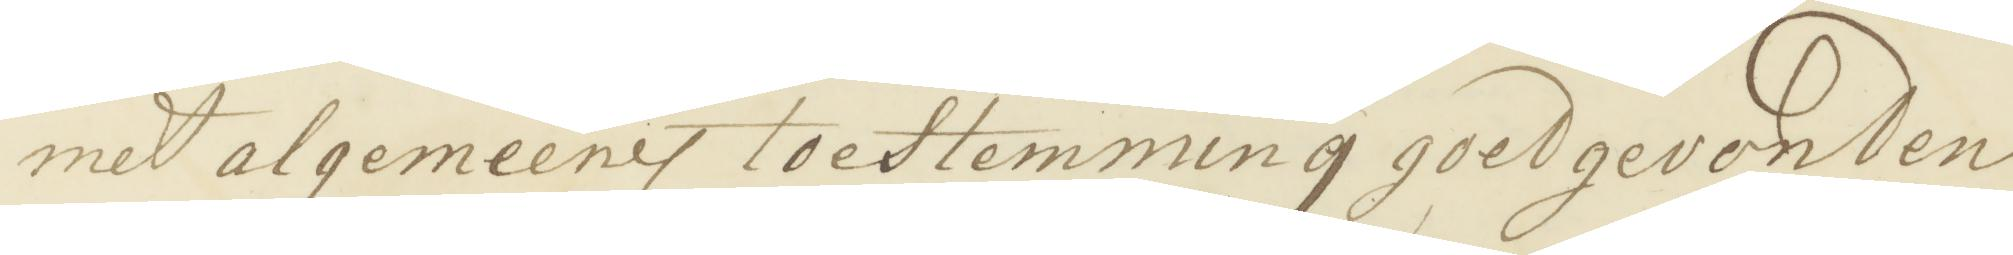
met algemeene toestemming goed gevonden
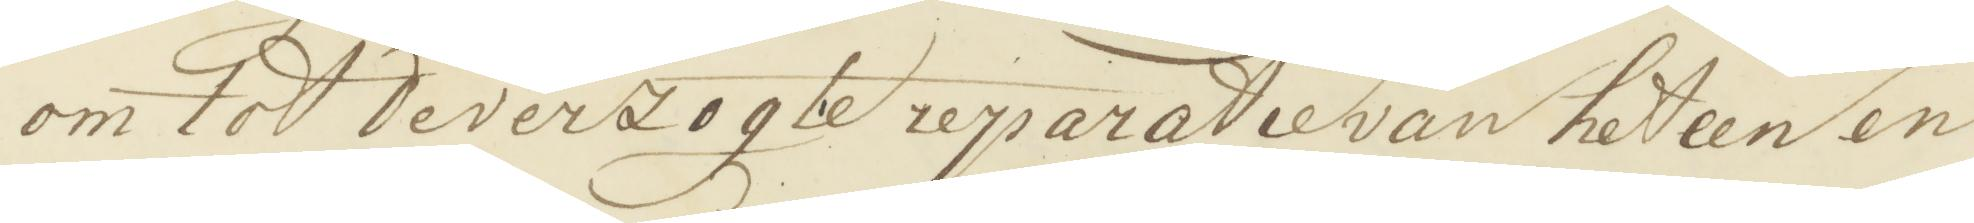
om tot de verzogte reparatie van het een en
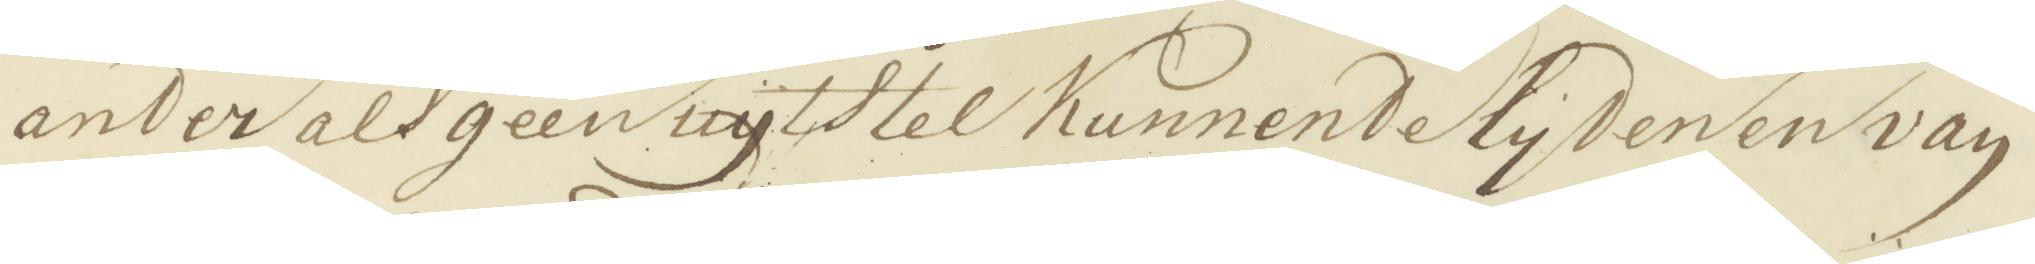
ander als geen uijtstel kunnende lijden en van
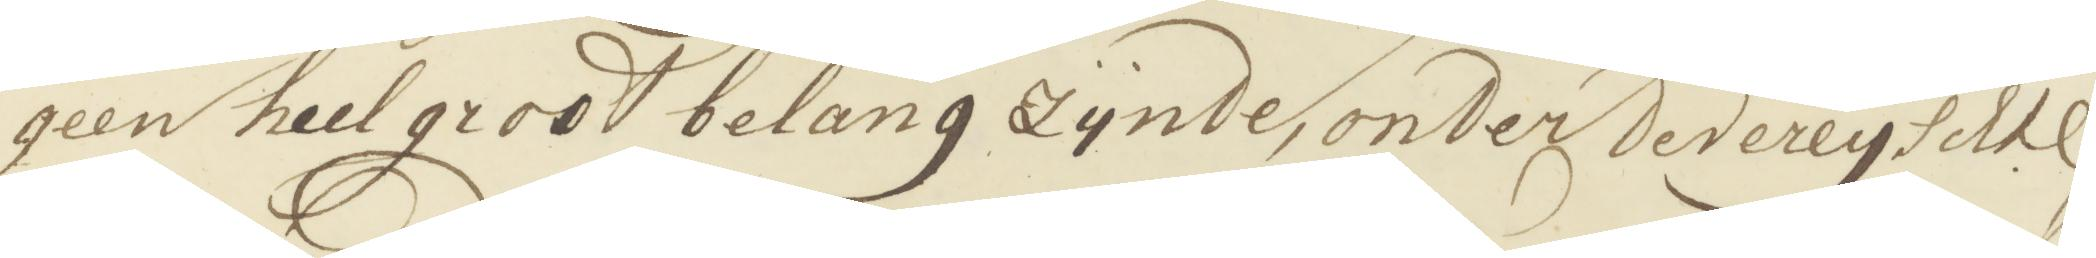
geen heel groot belang zijnde, onder de vereyschte
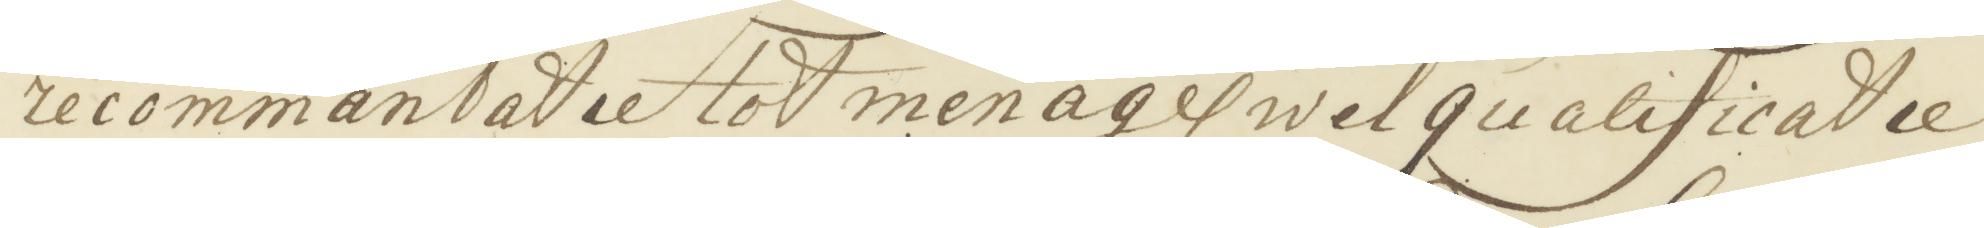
recommandatie tot menage wel qualificatie
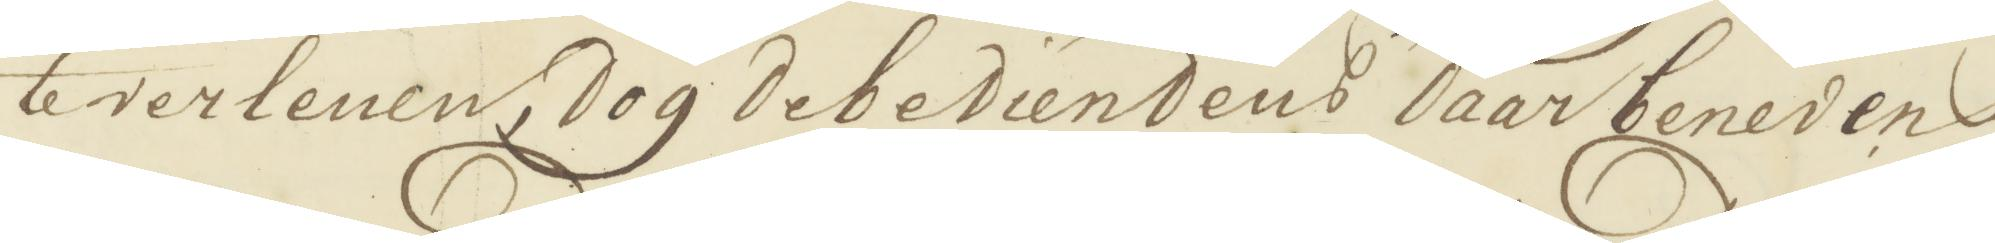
te verlenen, dog de bediendens daar benevens
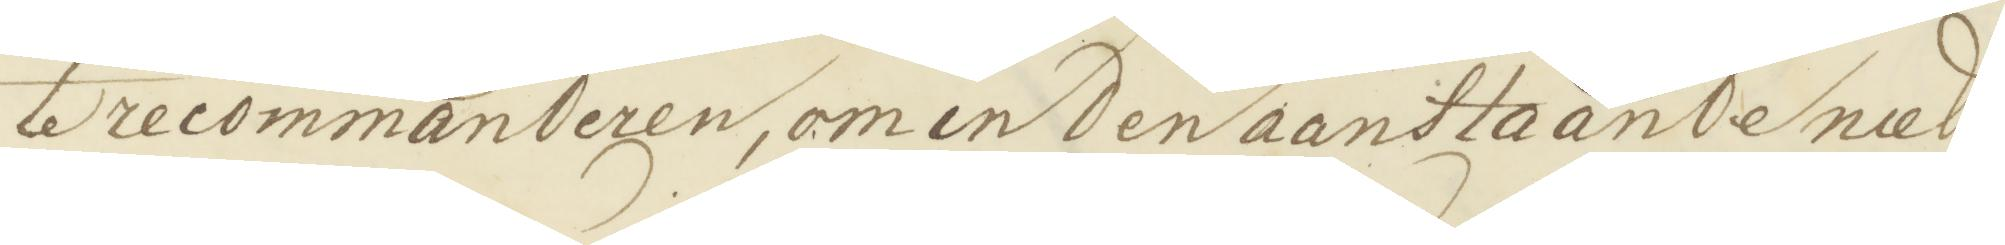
te recommanderen, om in den aanstaande niet
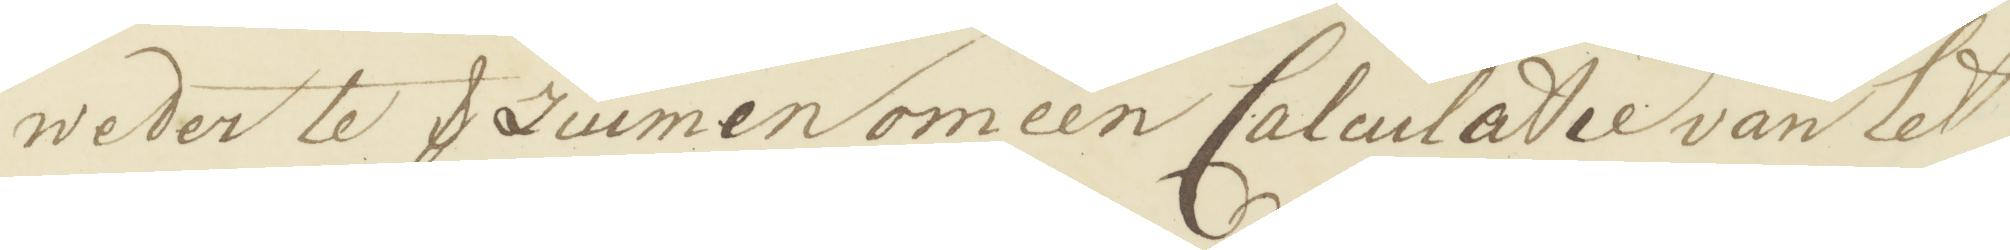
weder te verzuimen om een Calculatie van het
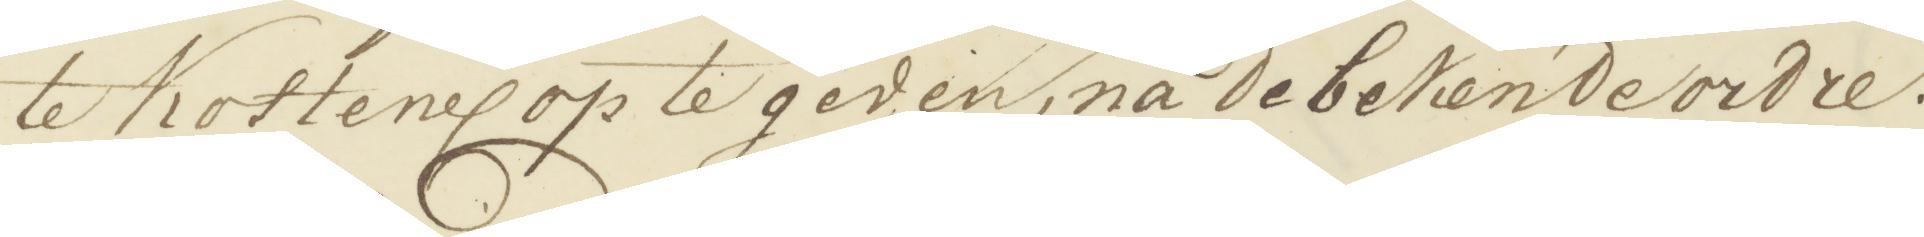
te kostene op te geven, na de bekende ordre.
